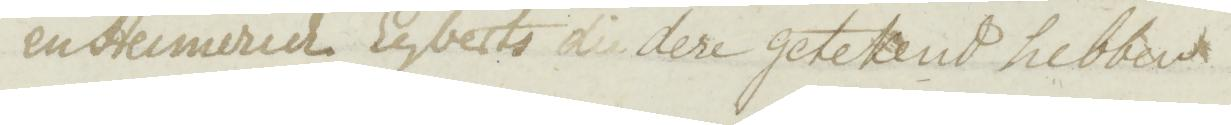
en Heimerich Egberts die deze getekend hebben
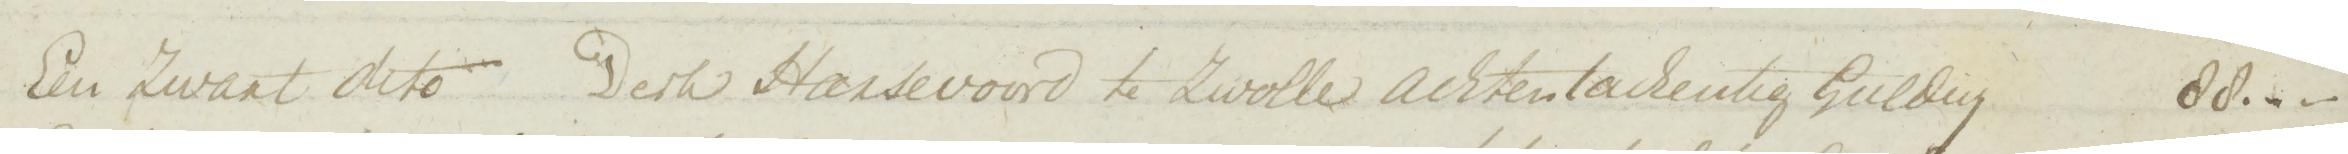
Een Zwart dito Derk Harsevoord te Zwolle achten tachentig Gulden 88. . —
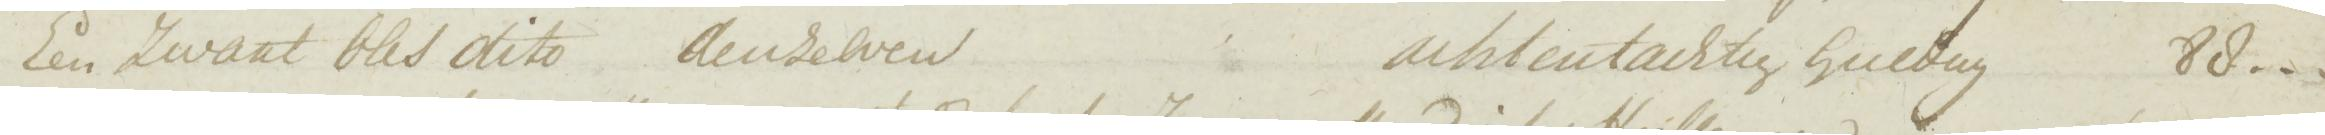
Een Zwart bles dito denzelven achtentachtig Gulden 88 . .—
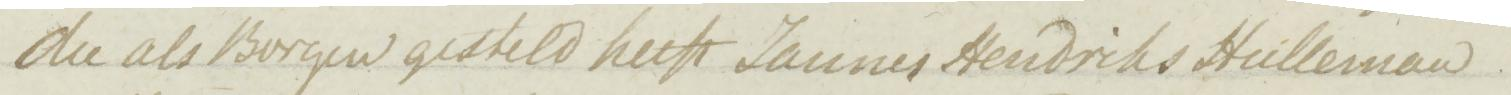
die als Borgen gesteld heeft Iannes Hendriks Hulleman
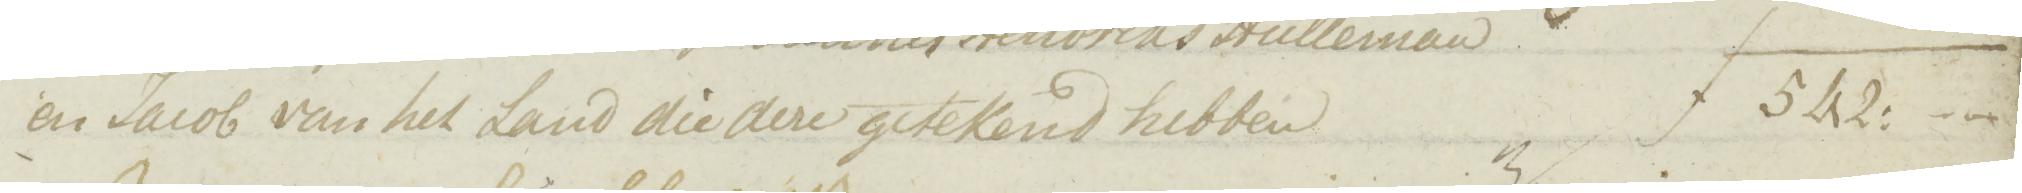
en Iacob van het Land die deze getekend hebben ƒ 542:--
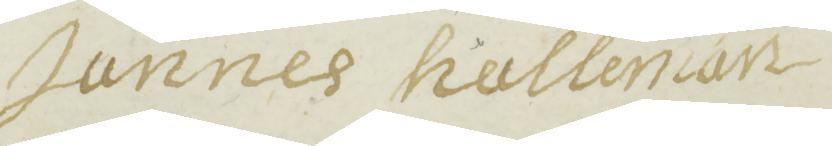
Jannes Hulleman
